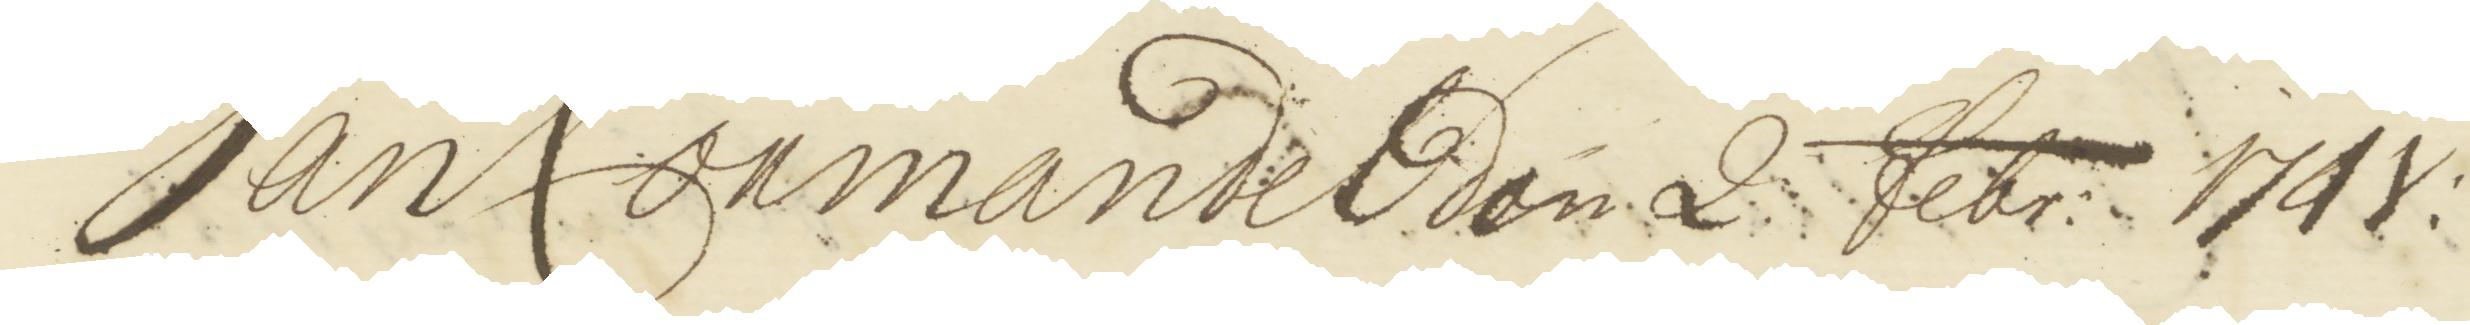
Van Cormandel den 2 Febr: 1741:
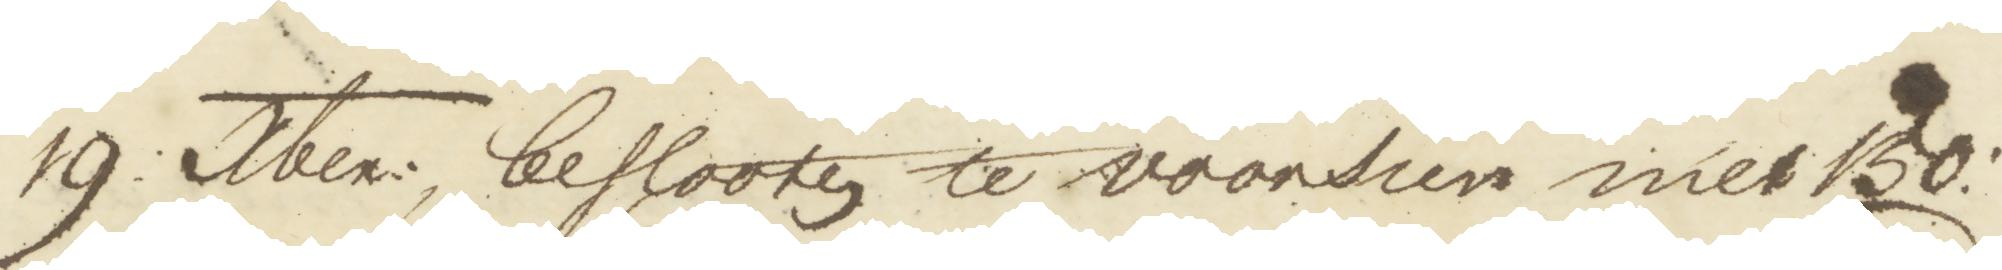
19: Xber:, beslooten te voorsien met 150:
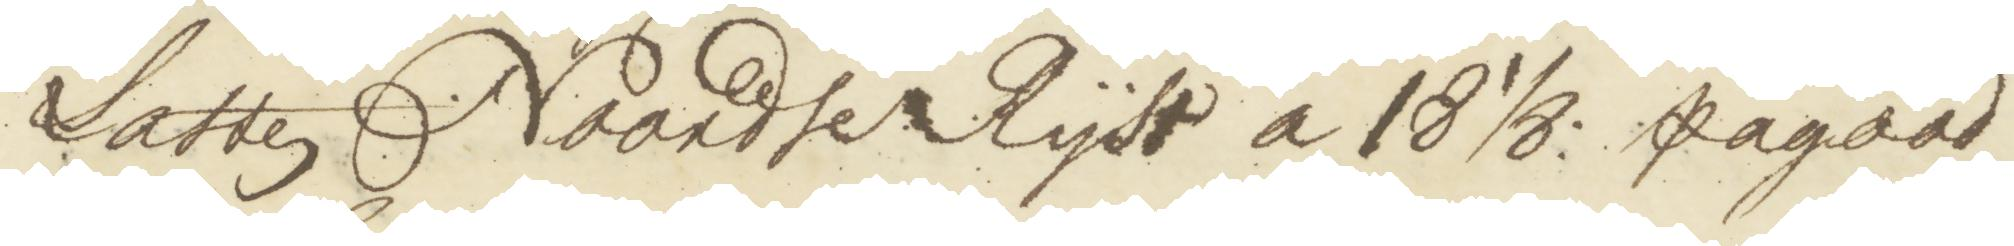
satten Noordse Rijst a 18 1/8: pagood
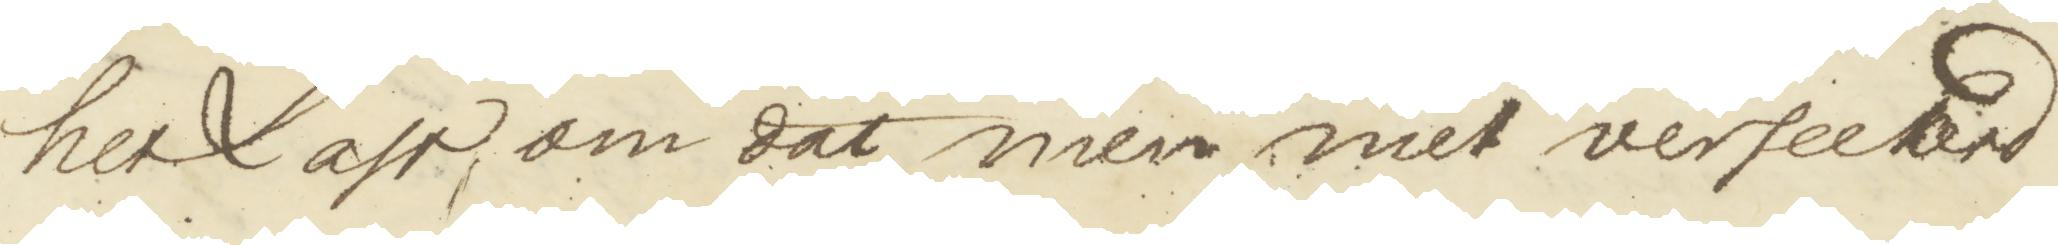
het Last, om dat men niet verseekerd
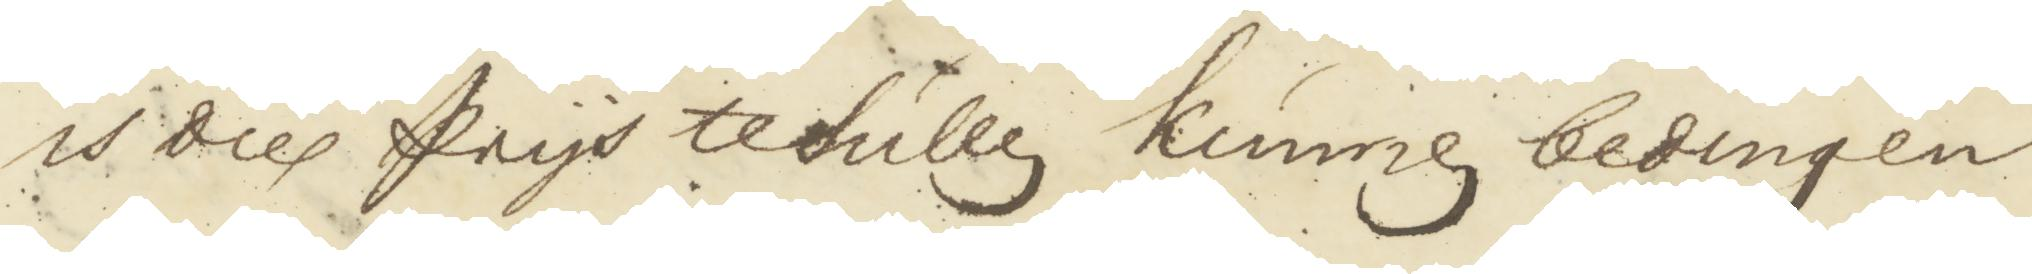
is die prijs tesullen kunnen bedingen
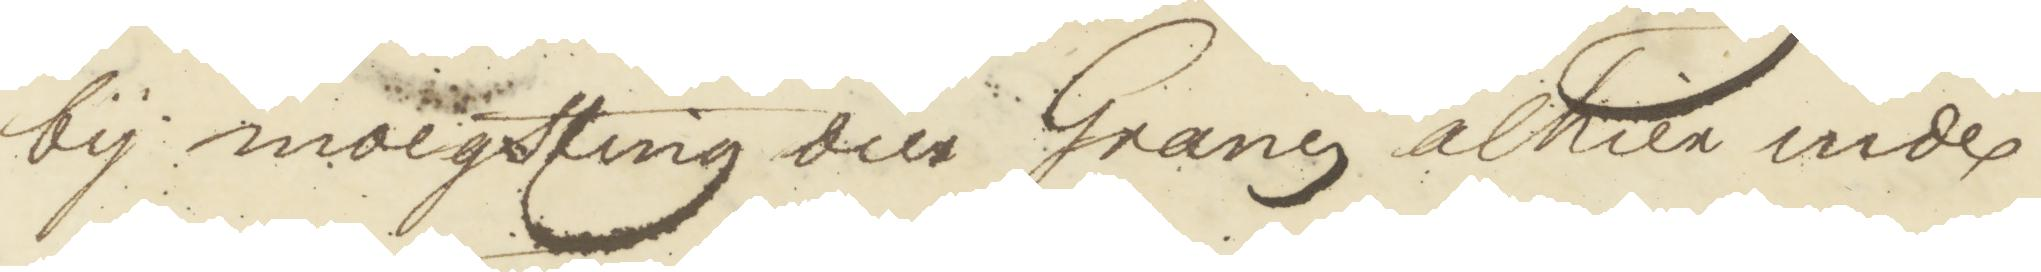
bij moegsting dier Granen alhier inde
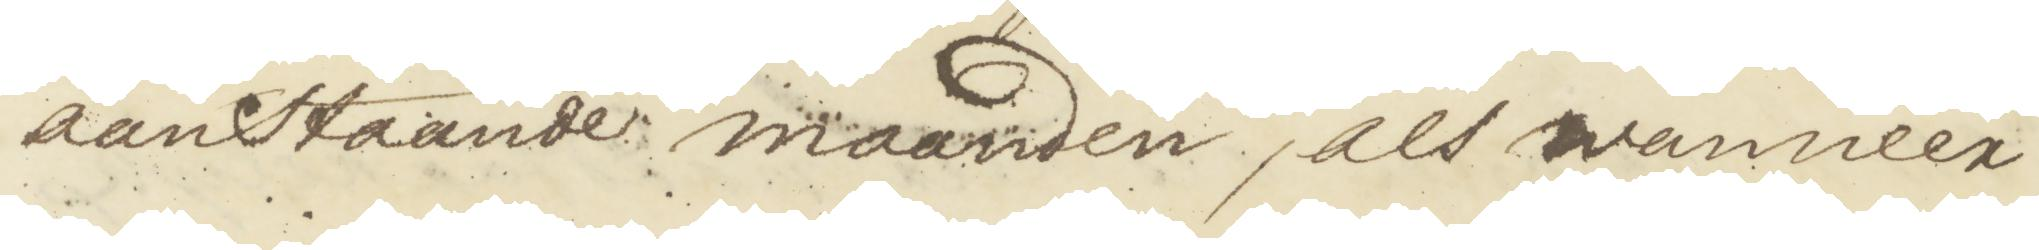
aanstaande maanden, als wanneer
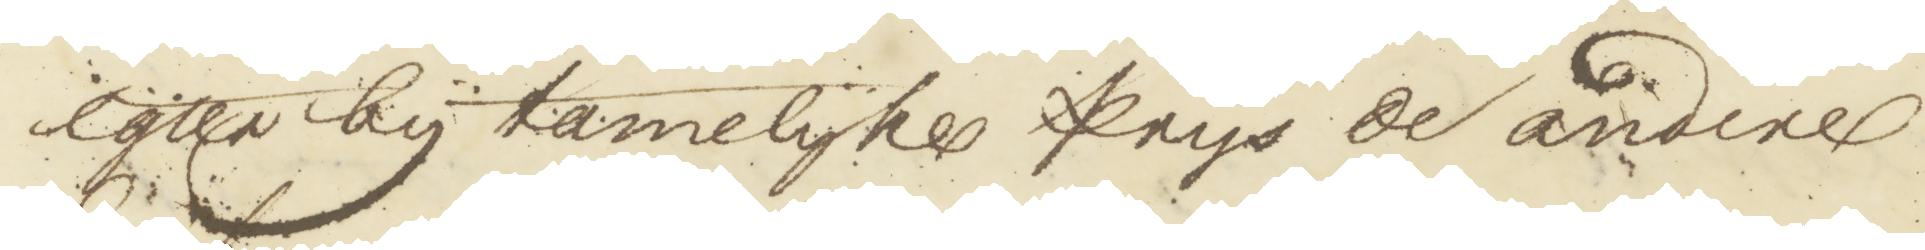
egter bij tamelijke prijs de andere
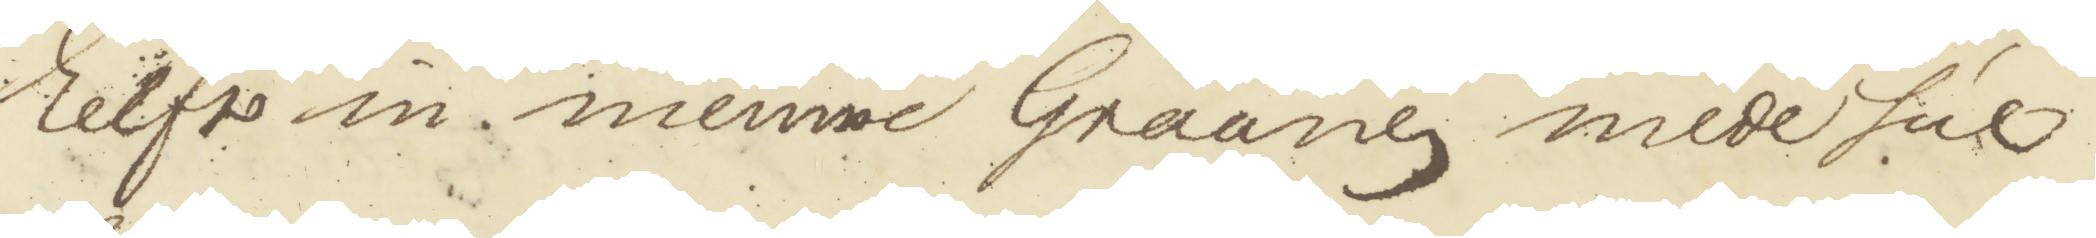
helft in nieuwe Graanen mede sul„
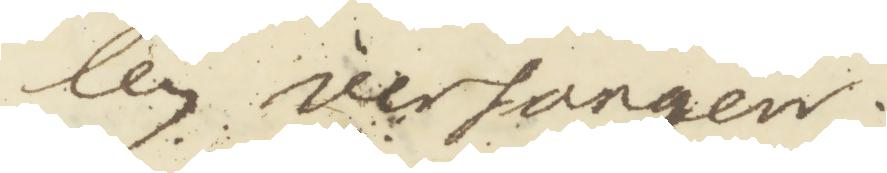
len verfangen.
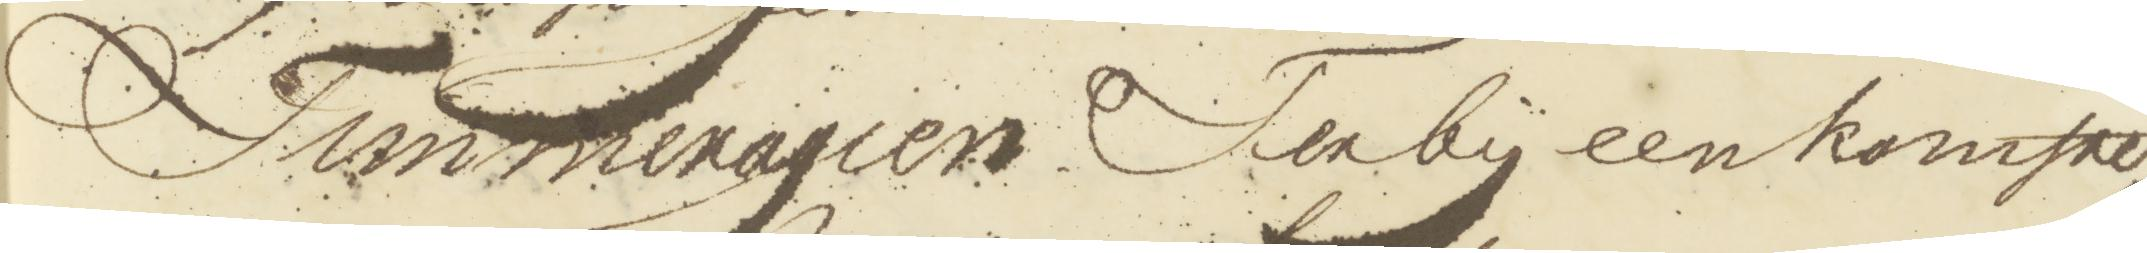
Tunmeragien Terbij eenkomste
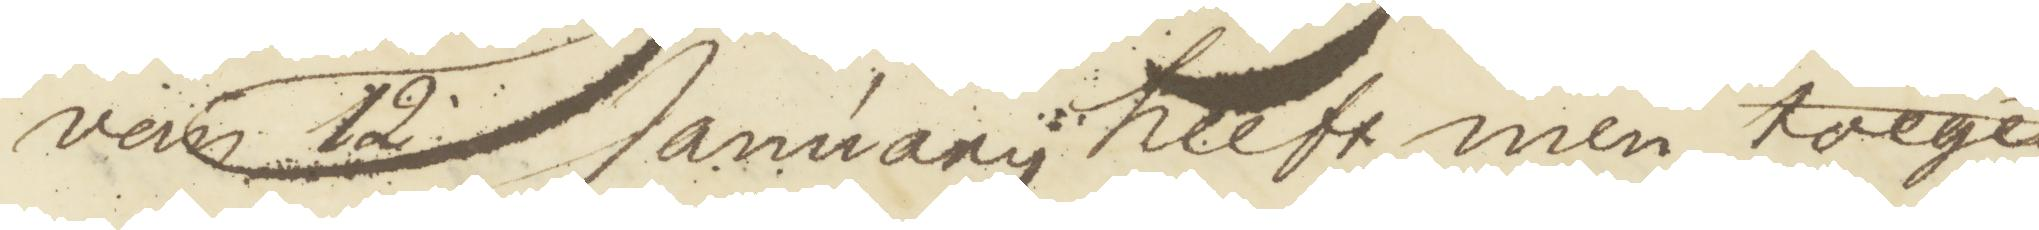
van 12 Januarij heeft men toege
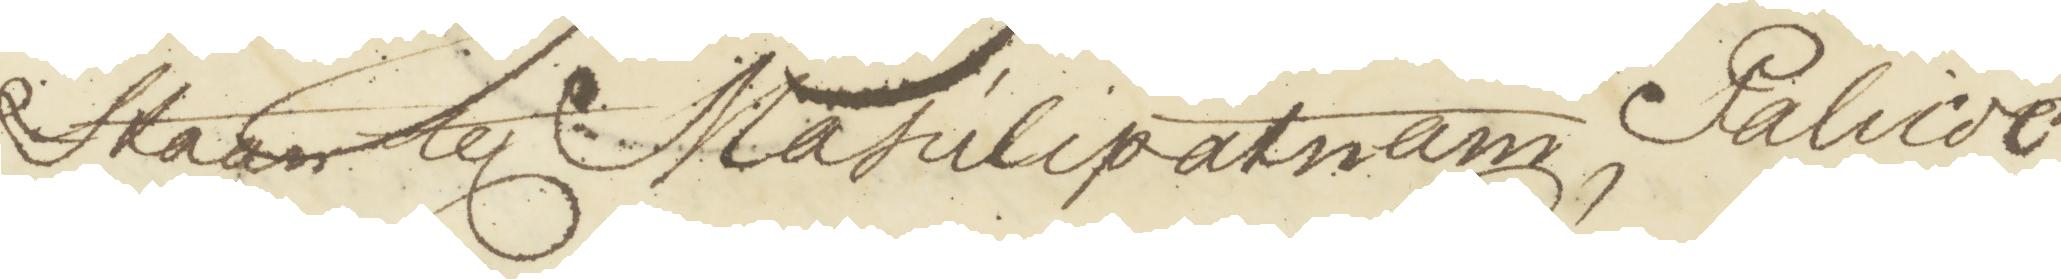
staan te Masulipatnam Palicol
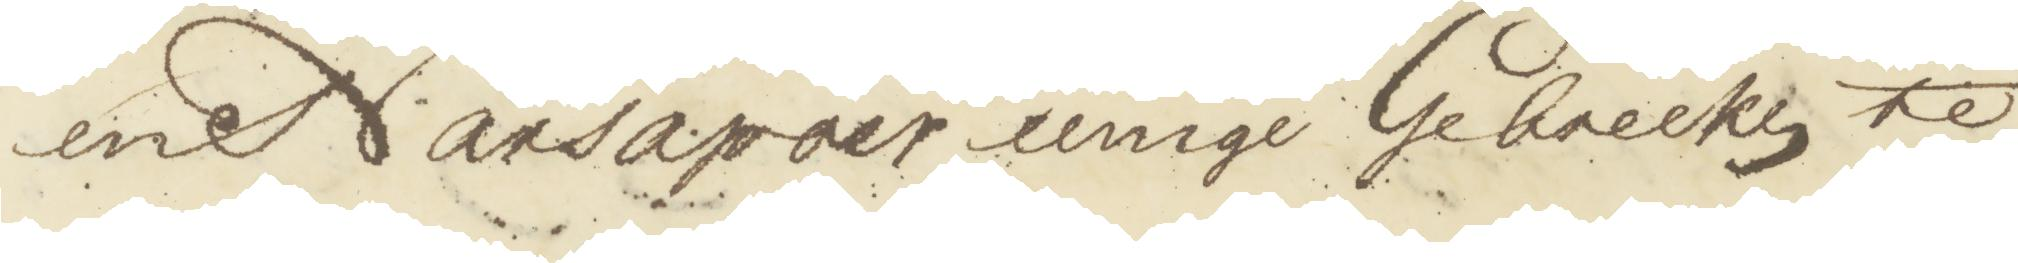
en Narsapoer eenige Gebreeken te
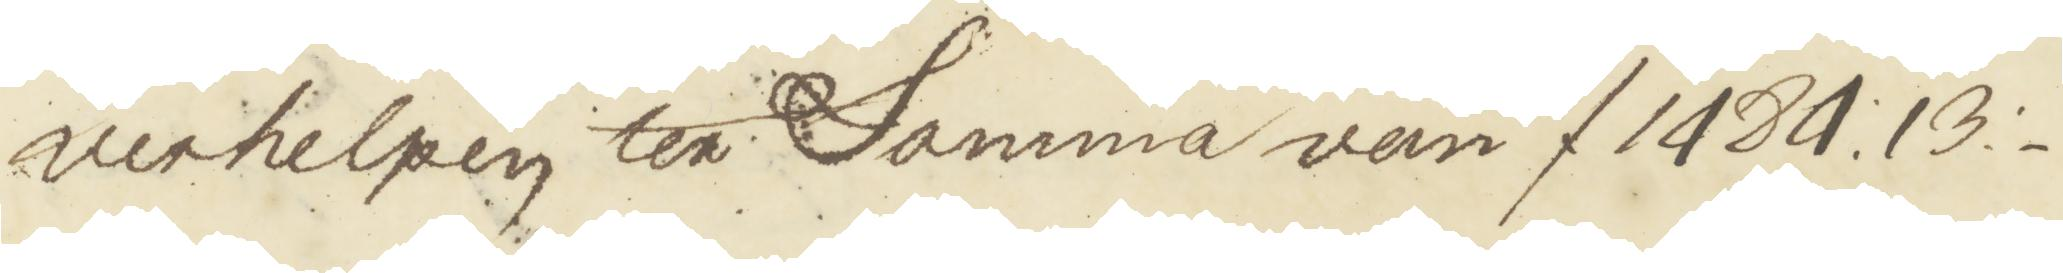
verhelpen ter Somma van ƒ 1484: 13: —
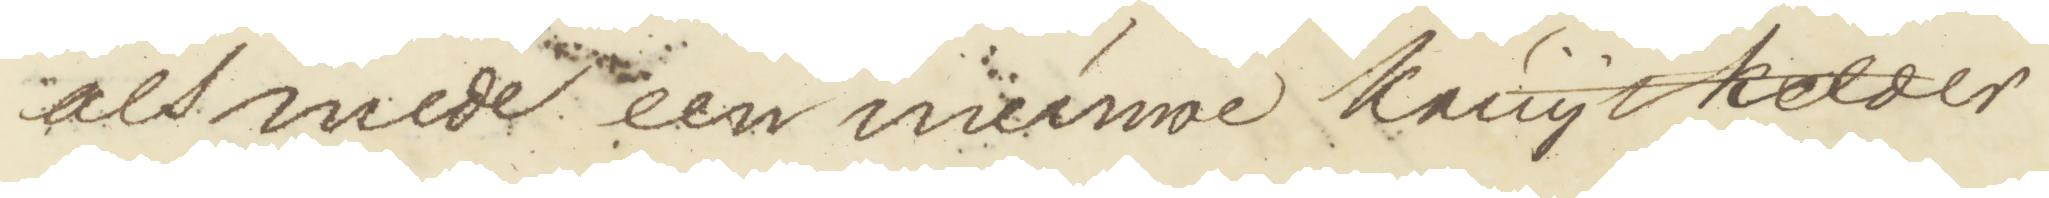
als mede een nieuwe kruijtkelder
